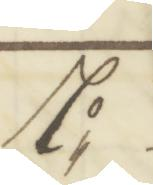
r„o
